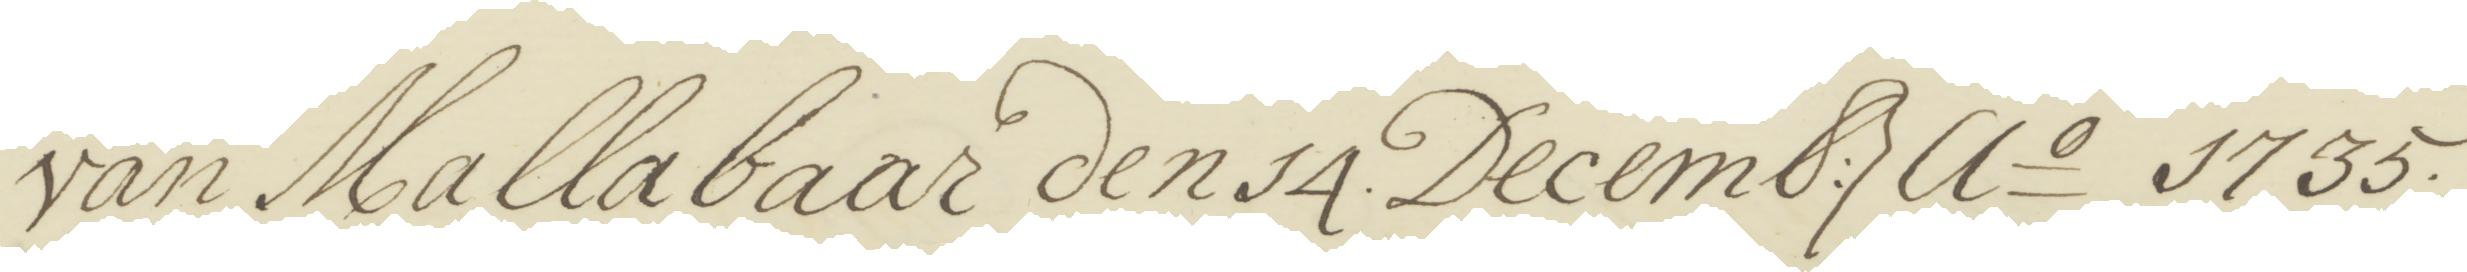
van Mallabaar den 14. Decemb:r A=o 1735.
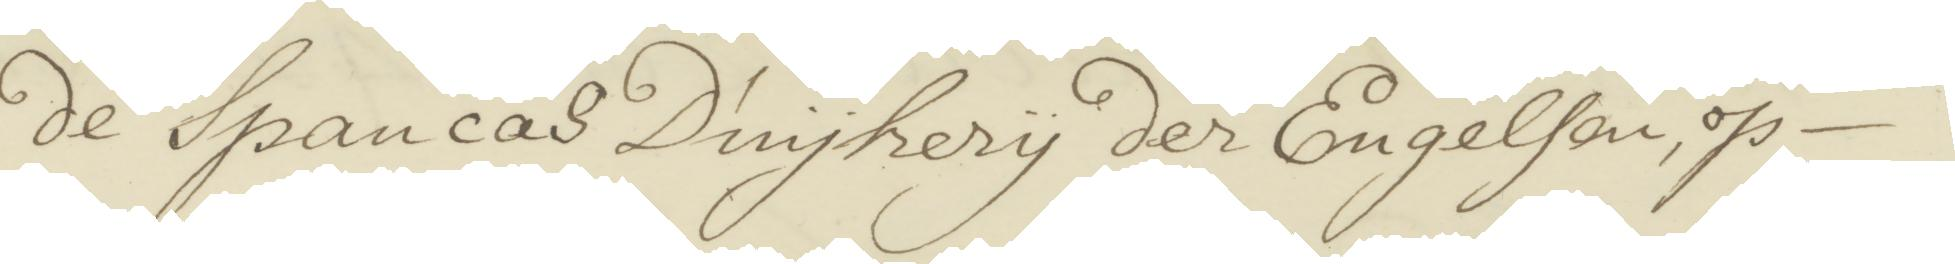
de spancas Duijkerij der Engelsen, op—
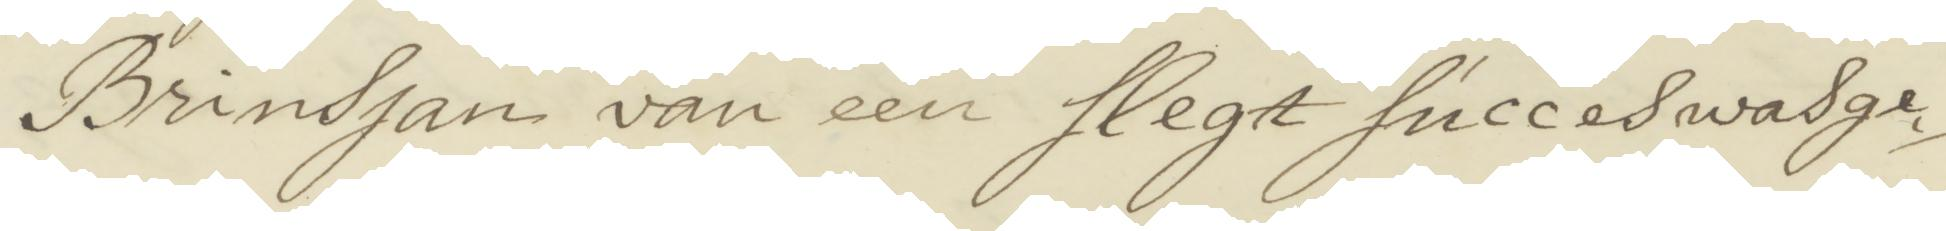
Brinsjan van een slegt succes was ge„
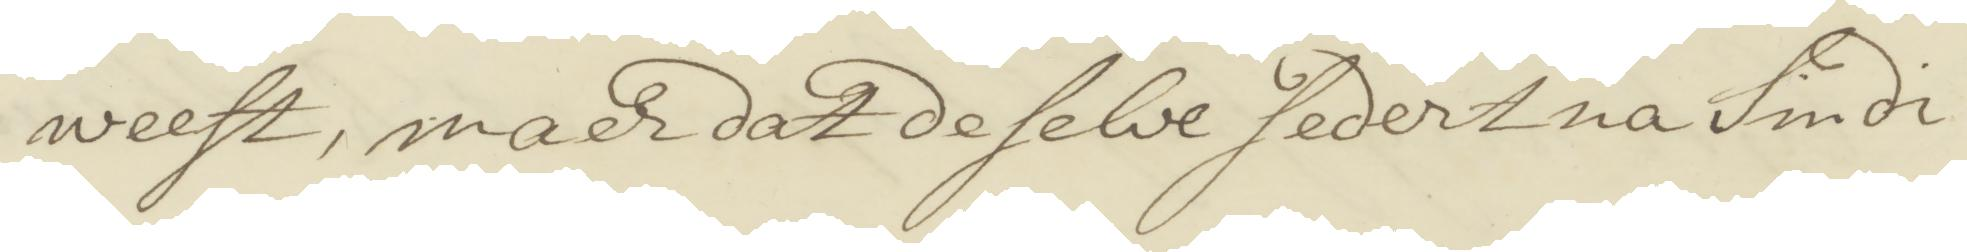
weest, maer dat deselve sedert na sindi
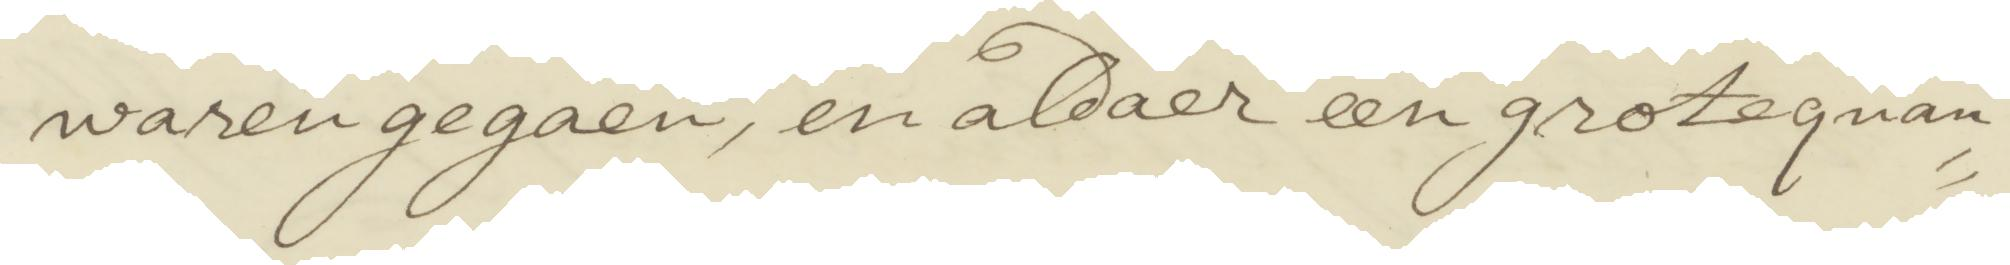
waren gegaen, en aldaer een grote quan„
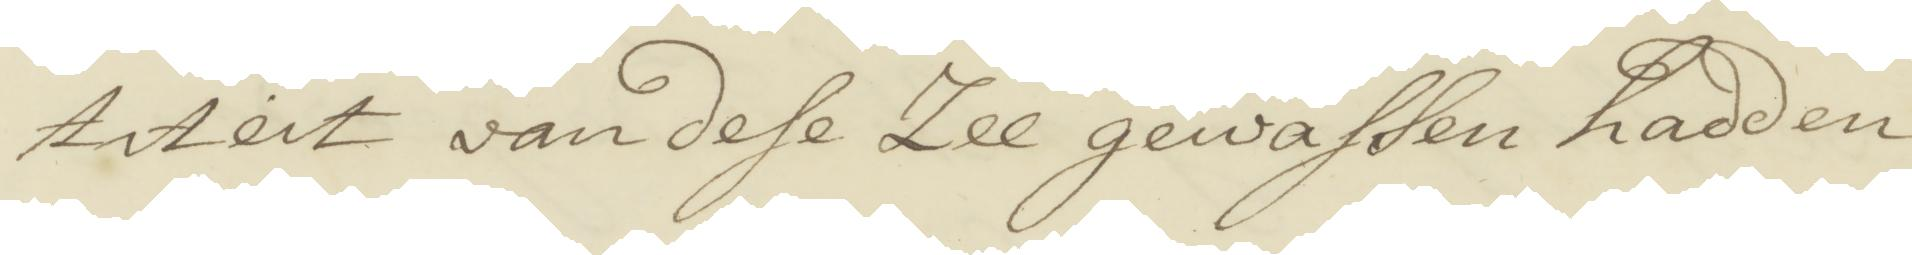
titeit van dese zee gewassen hadden
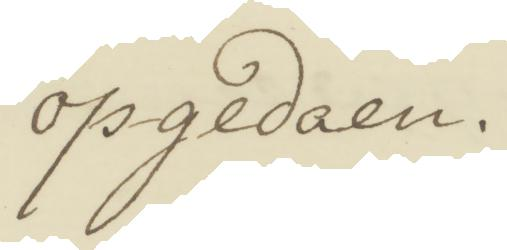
opgedaen.
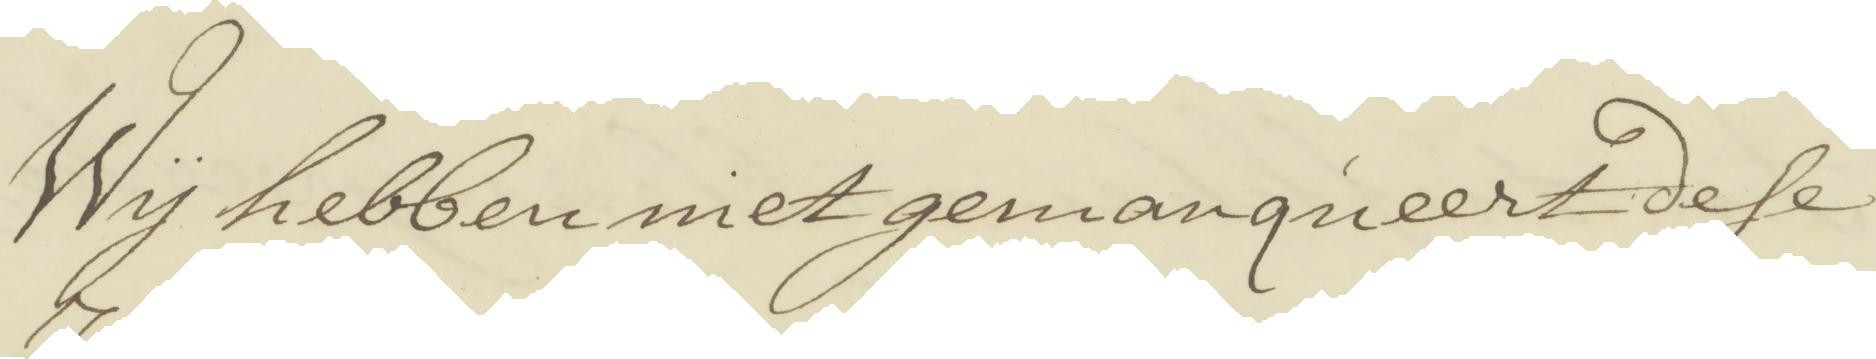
Wij hebben niet gemanqueert dese
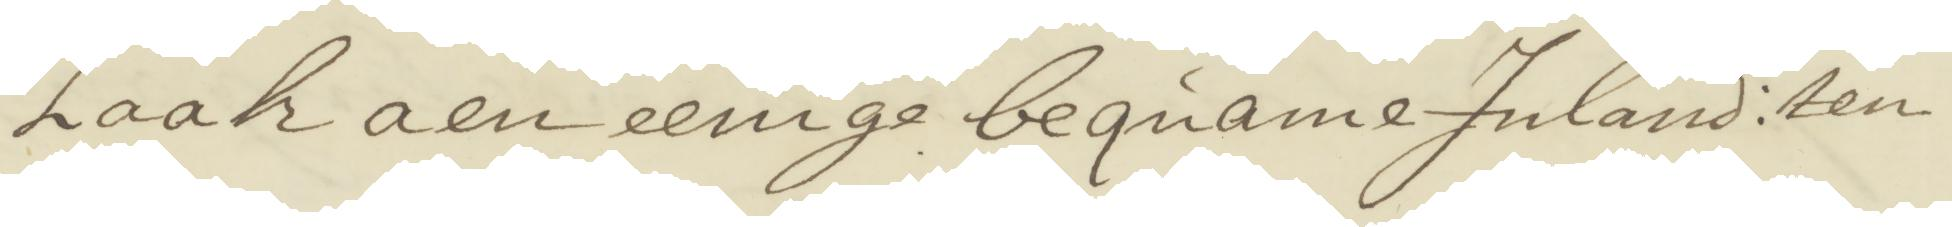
Zaak aen eenige bequame Jnland:s ten
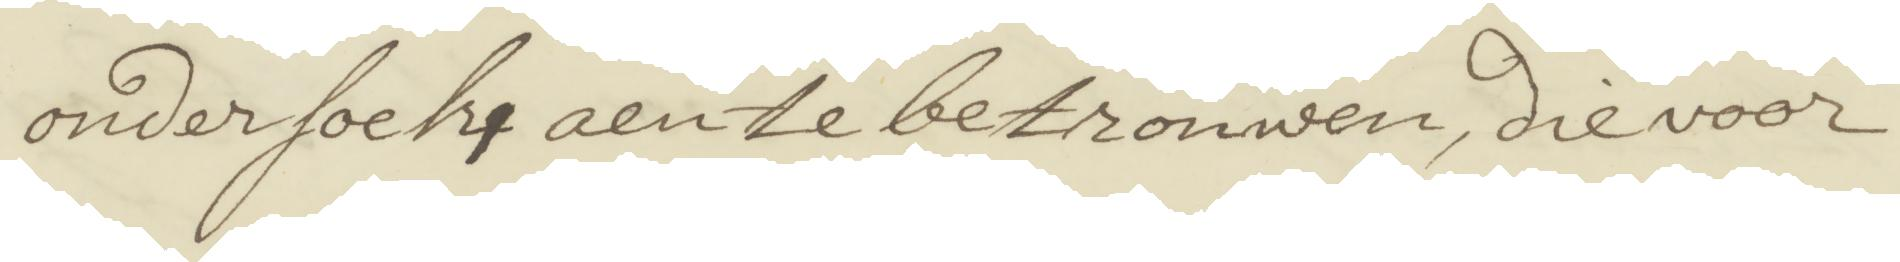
ondersoeke aen te betrouwen, die voor
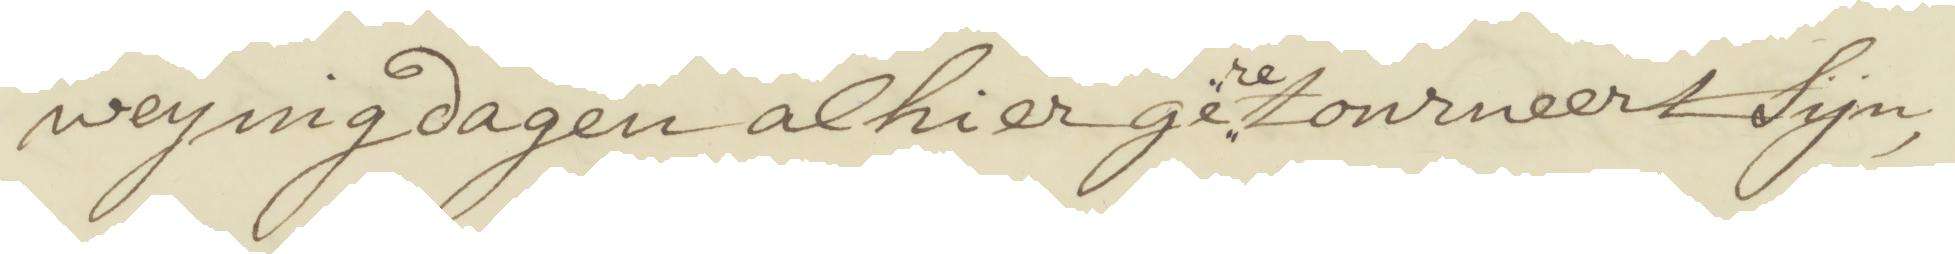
weynig dagen alhier ge„„re tourneert sijn,
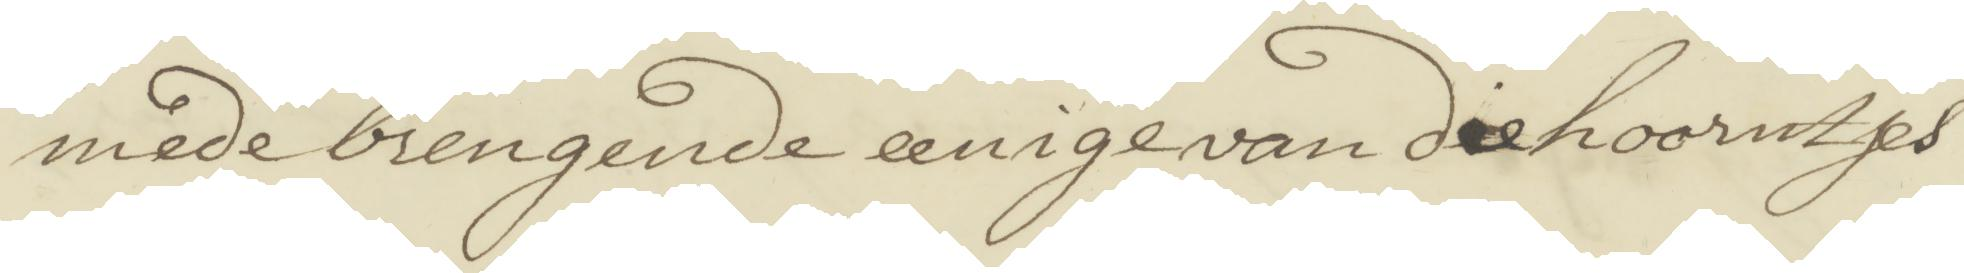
mede brengende eenige van die hoorntjes
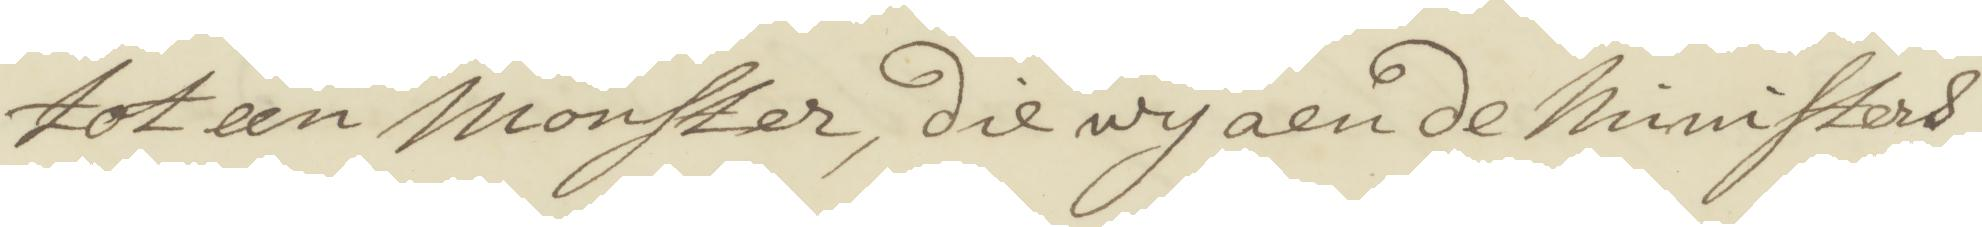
tot een monster, die wij aen de ministers
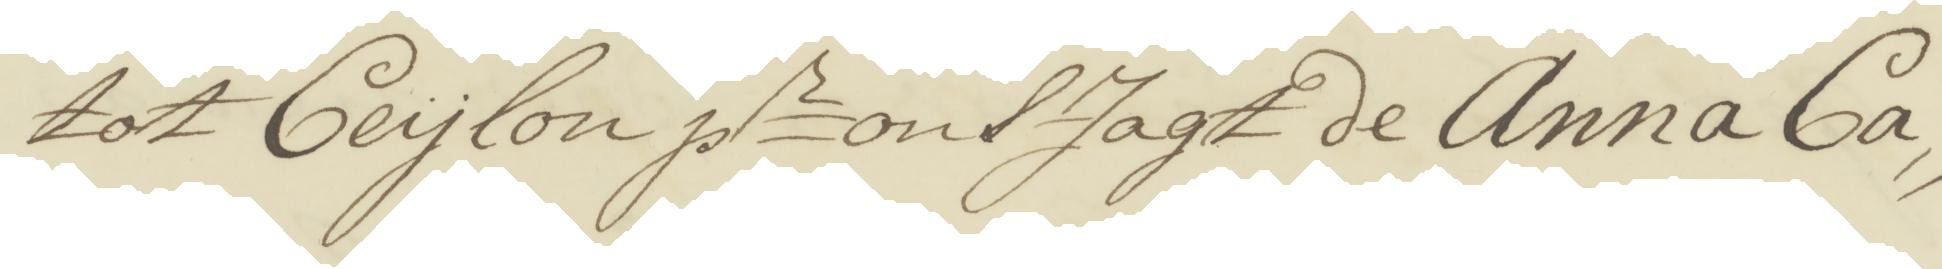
tot Ceijlon p=r ons Jagt de Anna Ca„
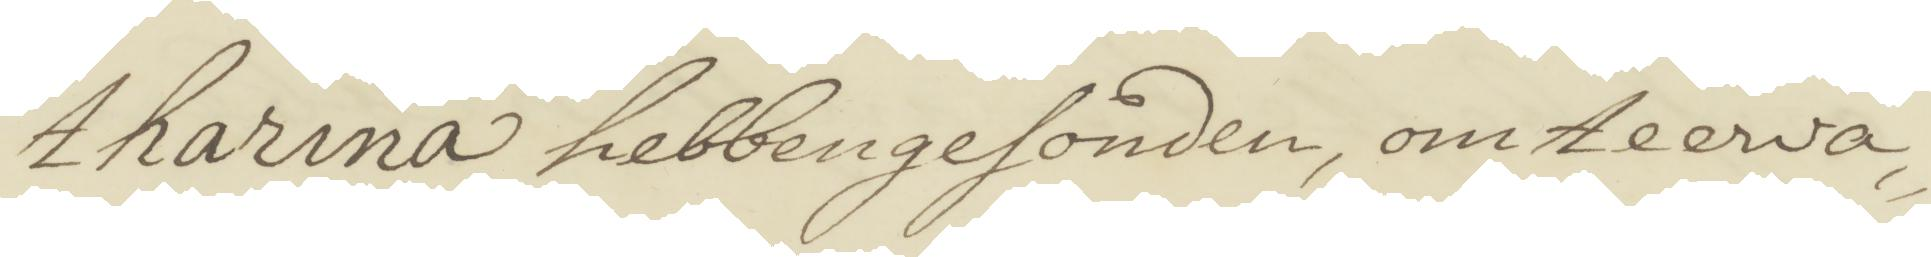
tharina hebben gesonden, om te erva„
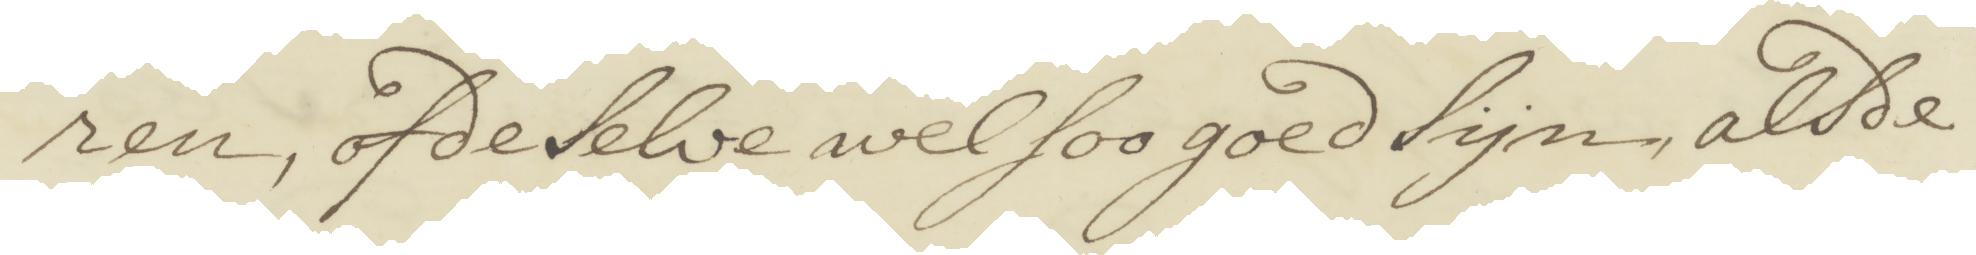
ren, of de selve wel soo goed sijn, als de
